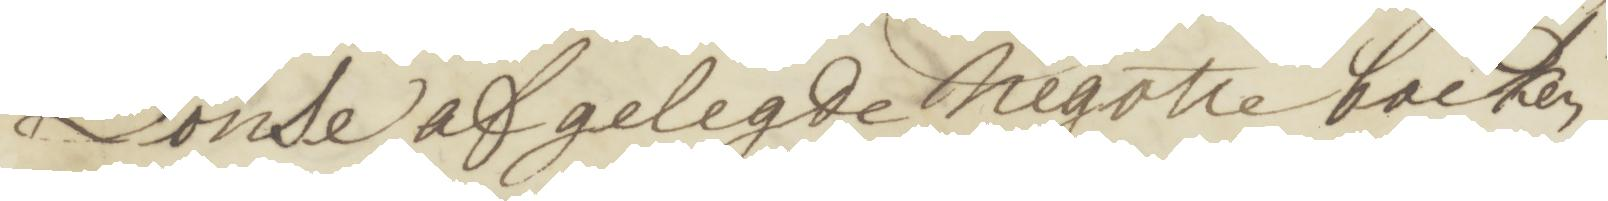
Lonse afgelegde negotie boeken
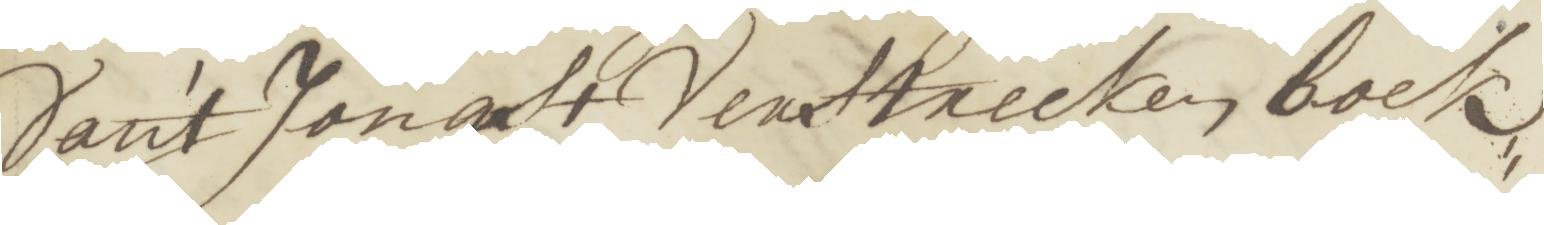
van’t Jongst Verstreeken boek„
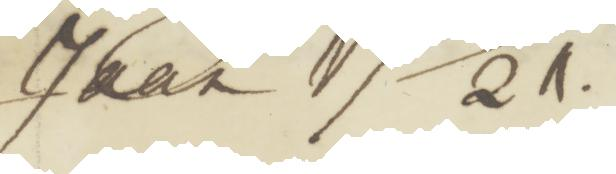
Jaar 17 23/21.
